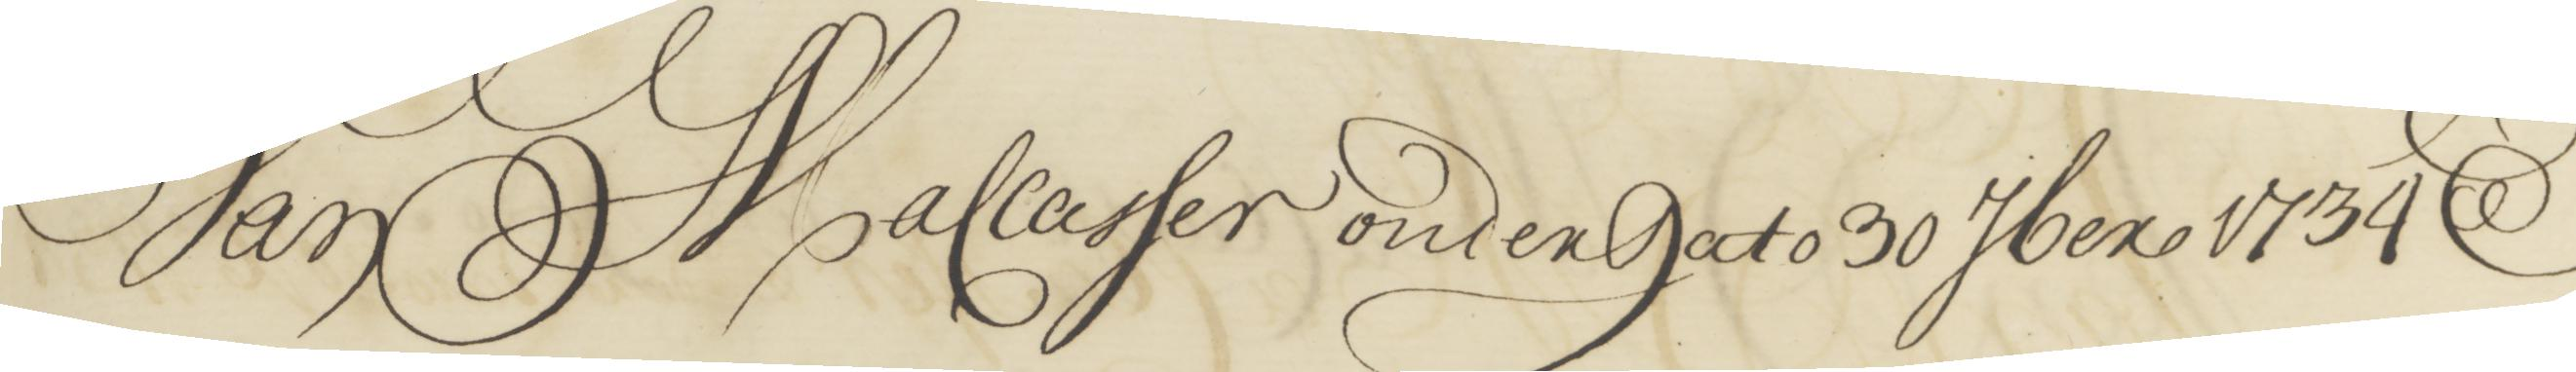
Van Maccasser onder Dato 30 Jber 1734
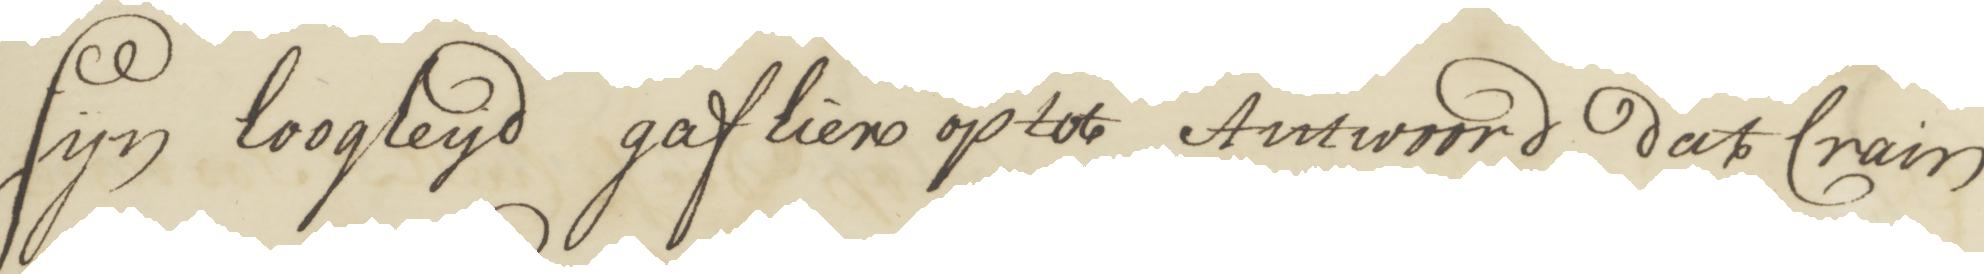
sijn hoogheijd gaf hier op tot Antwoord dat Crain
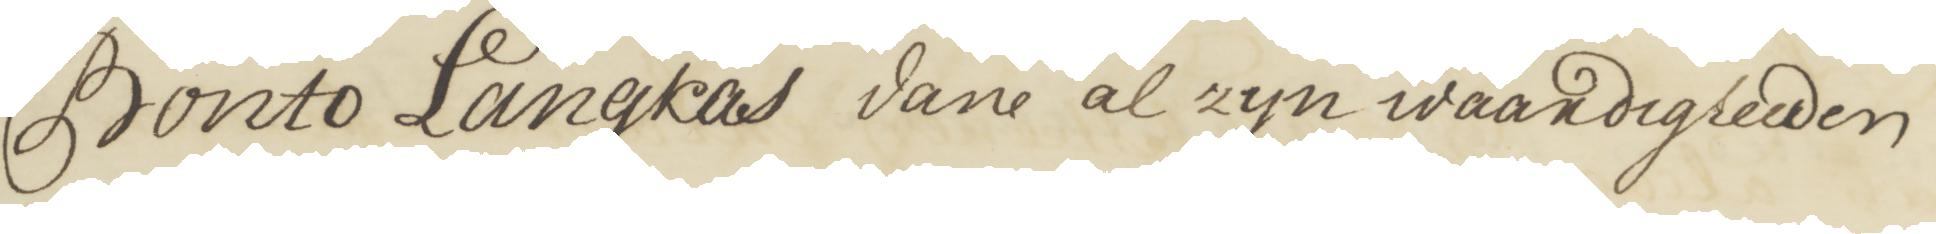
Bonto Langkas dane al zijn waardigheeden
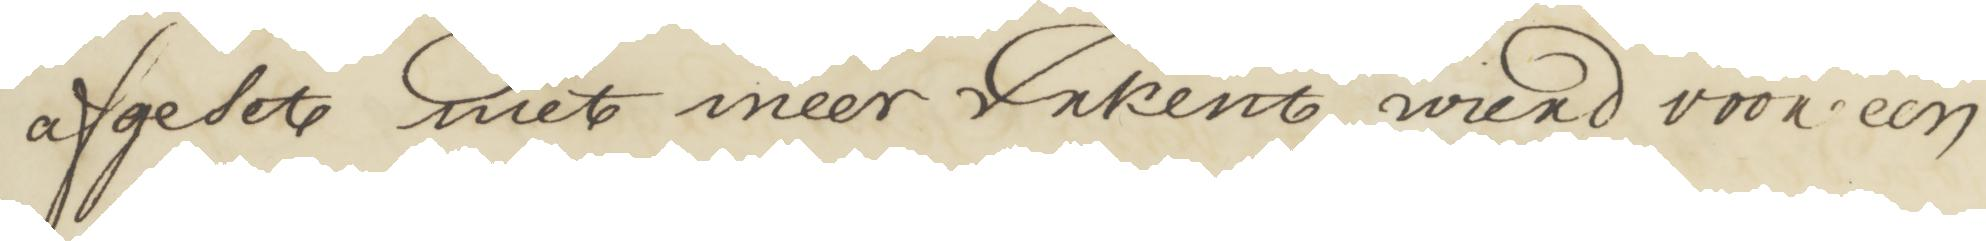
afgeset niet meer Erkent wierd voor een
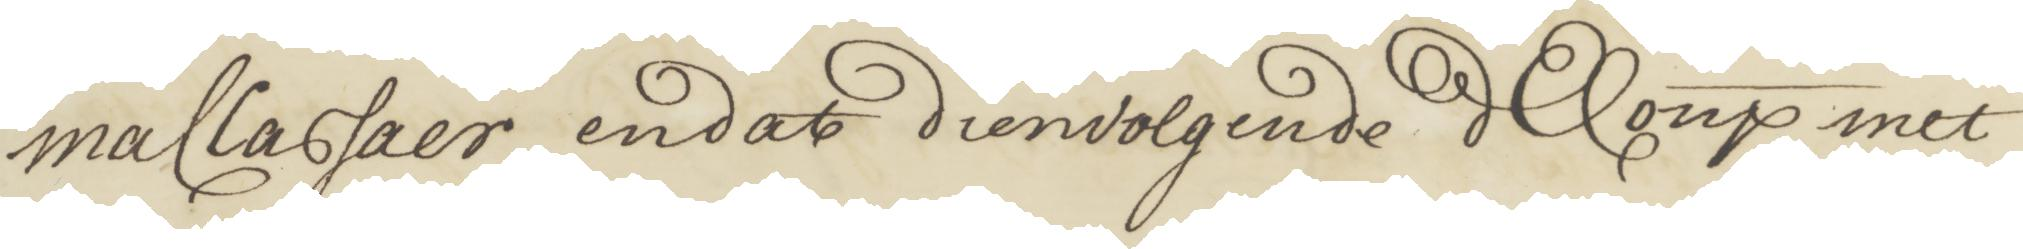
maccassaer en dat dienvolgende dEComp met
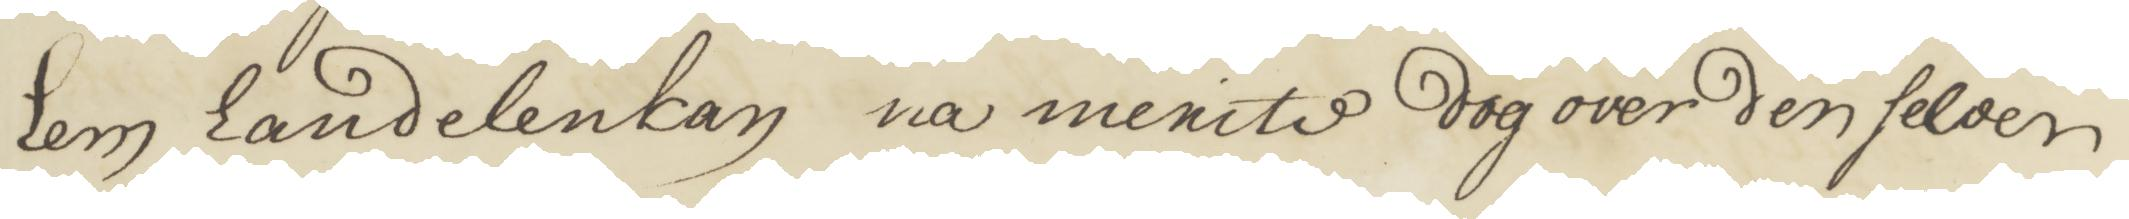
hem handelen kan na merite dog over den selven
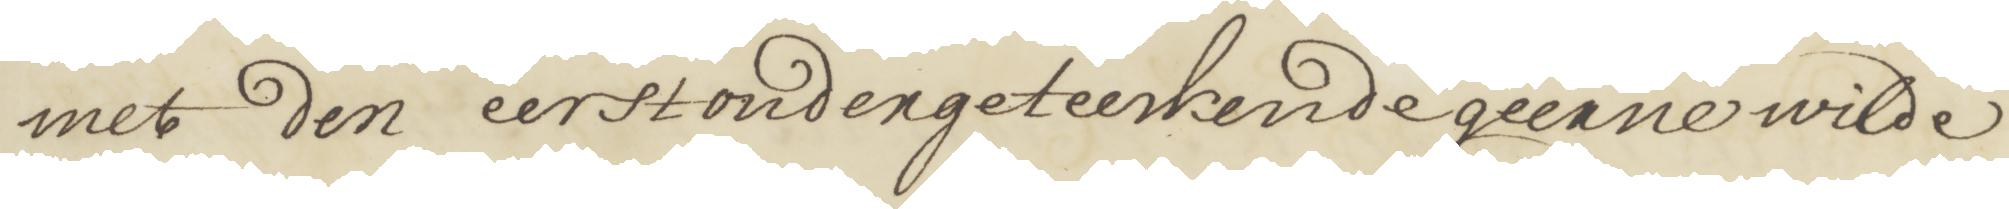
met den eerst ondergeteeckende geerne wilde
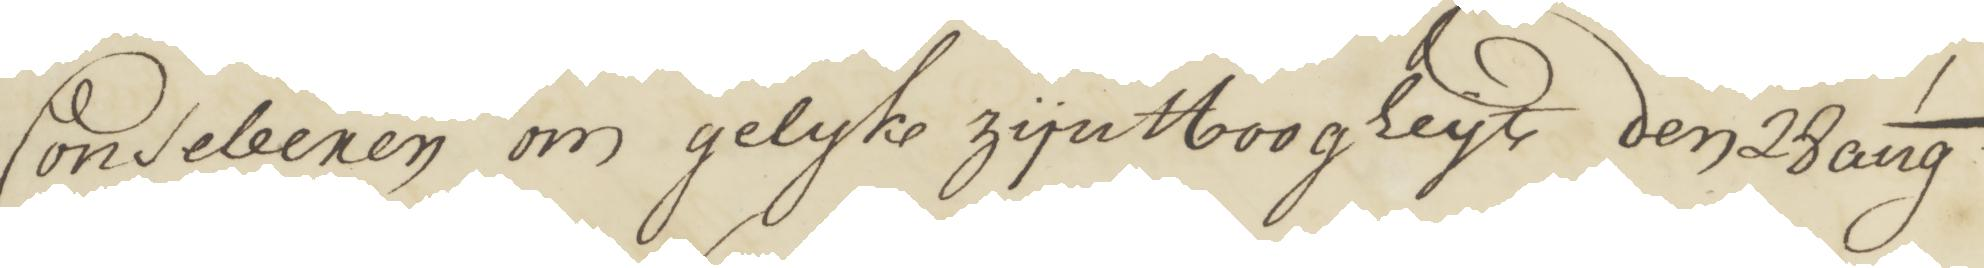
Conseleeren om gelyk zijn Hoogheijt den 28 aug
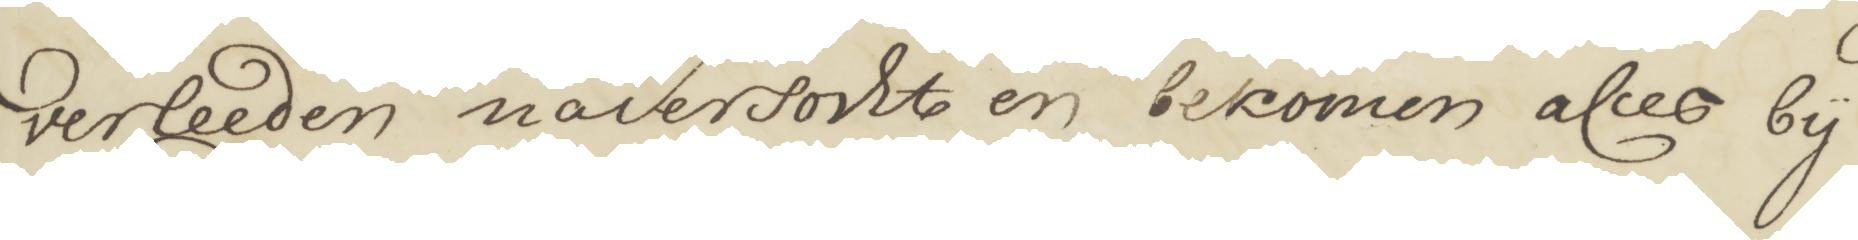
verleeden naversocht en bekomen acces bij
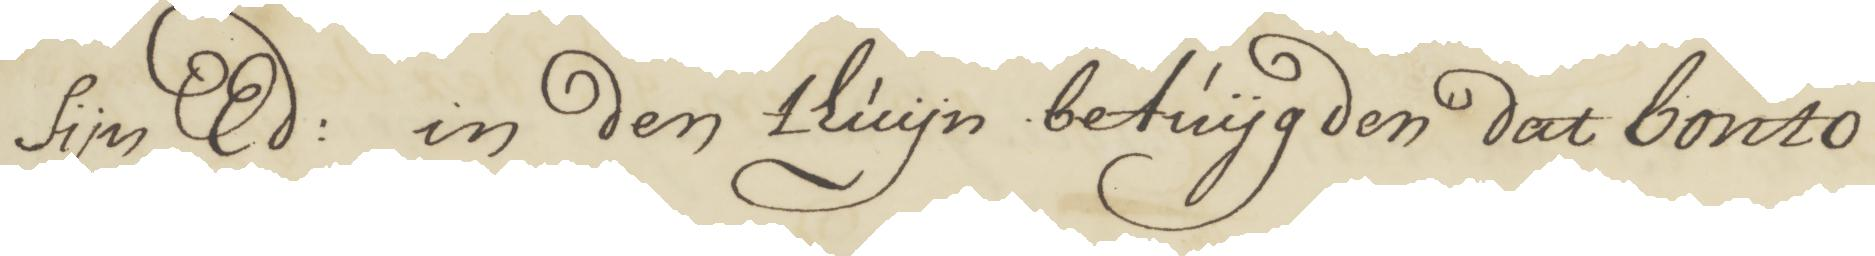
sijn Ed: in den thuijn betuijgden dat bonto
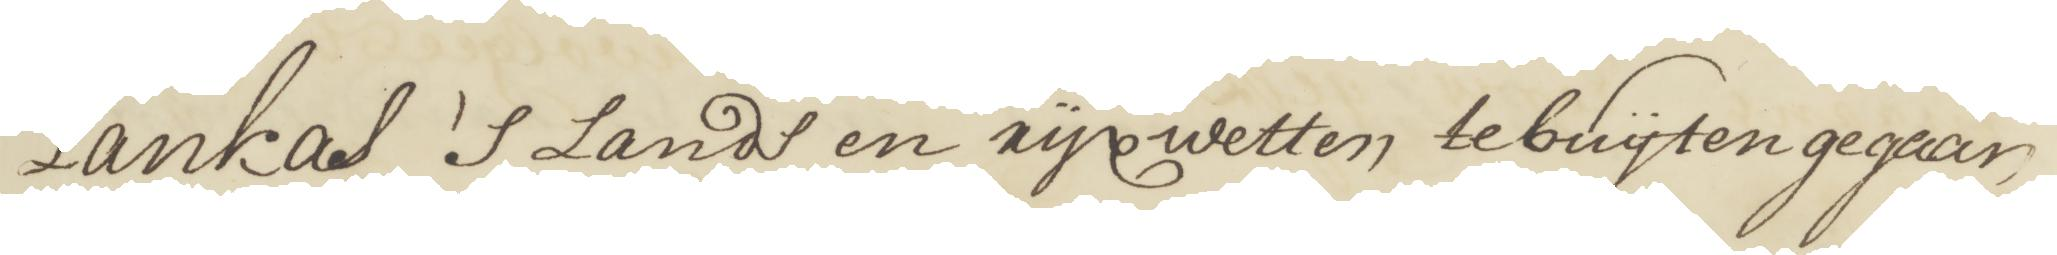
Lankas 's lands en rijxwetten te buijten gegaan
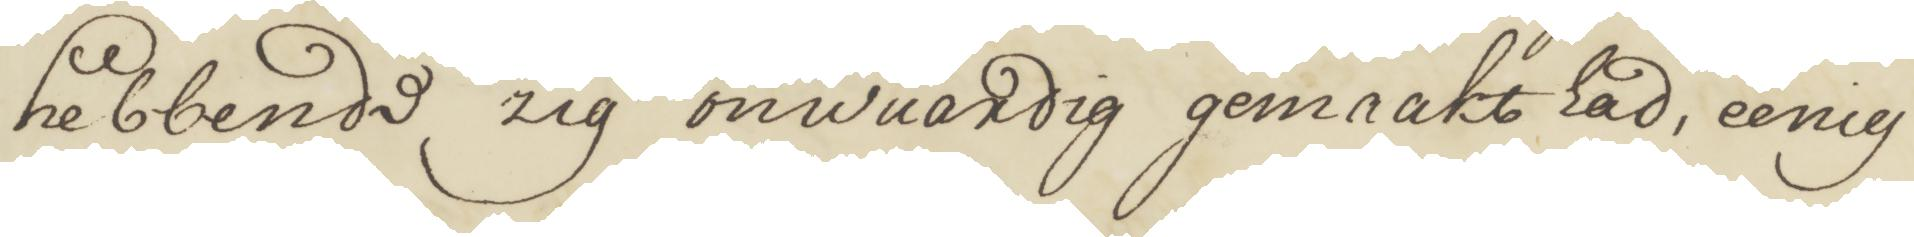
hebbende zig onwaardig gemaakt had, eenig
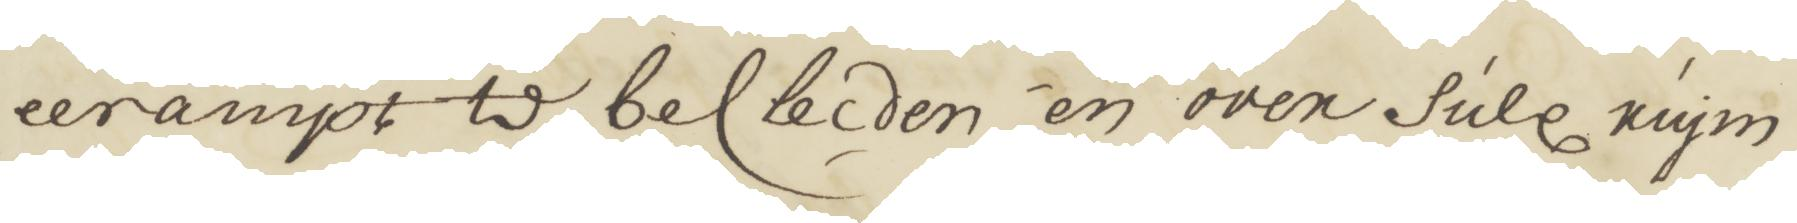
eerampt te becleeden en over sulx ruijm
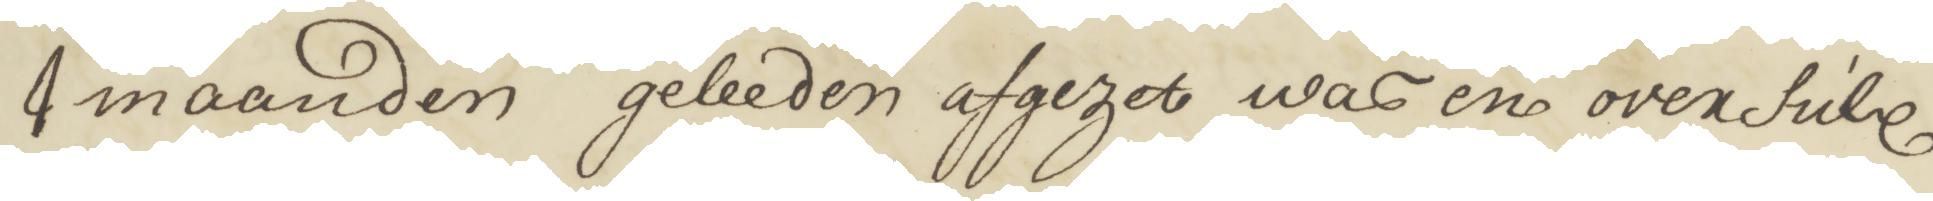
4 maanden geleeden afgezet was en over sulx
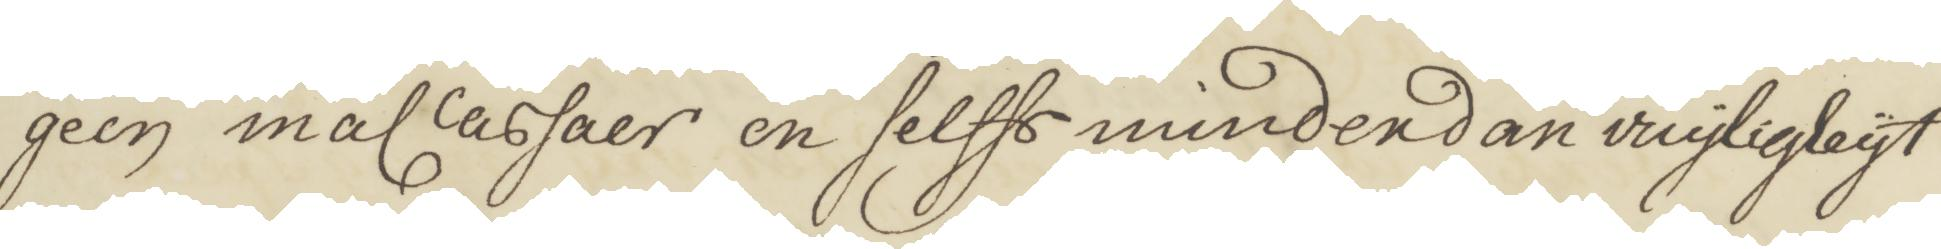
geen maccassaer en selffs minder dan vuijligheijt
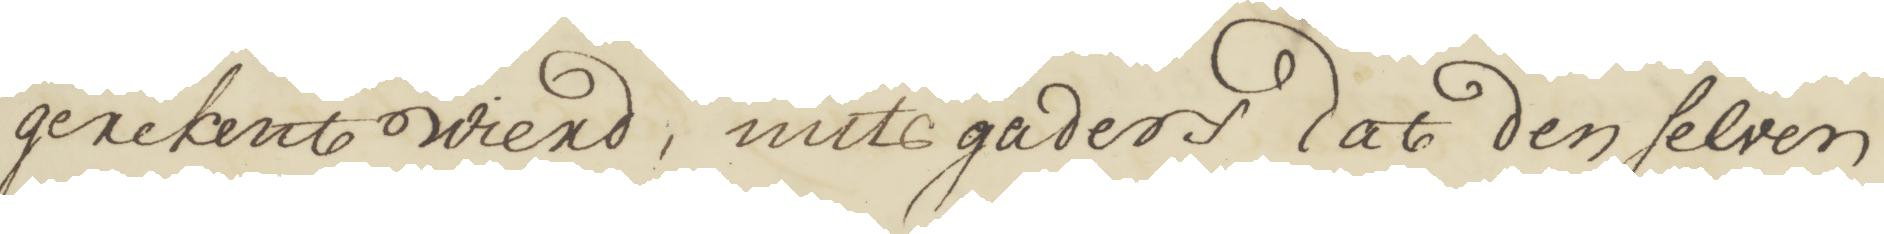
gerekent wierd; mitsgaders dat den selven
